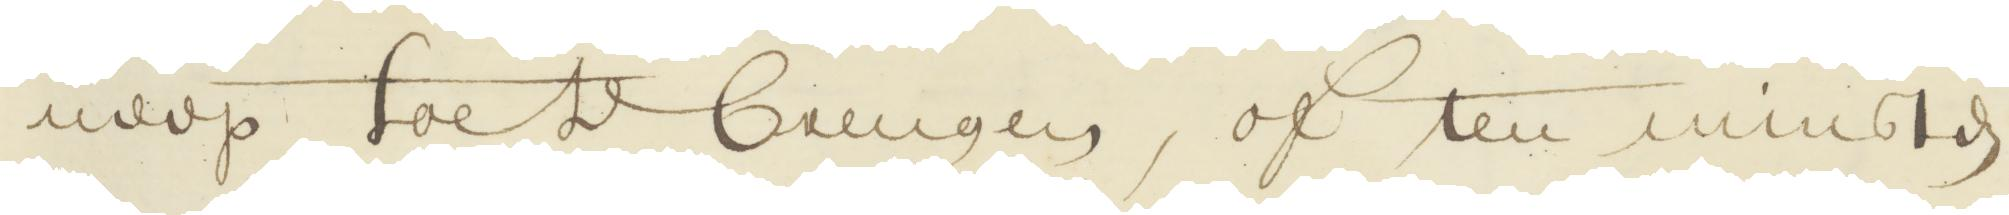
neep toe te brengen, of ten minsten
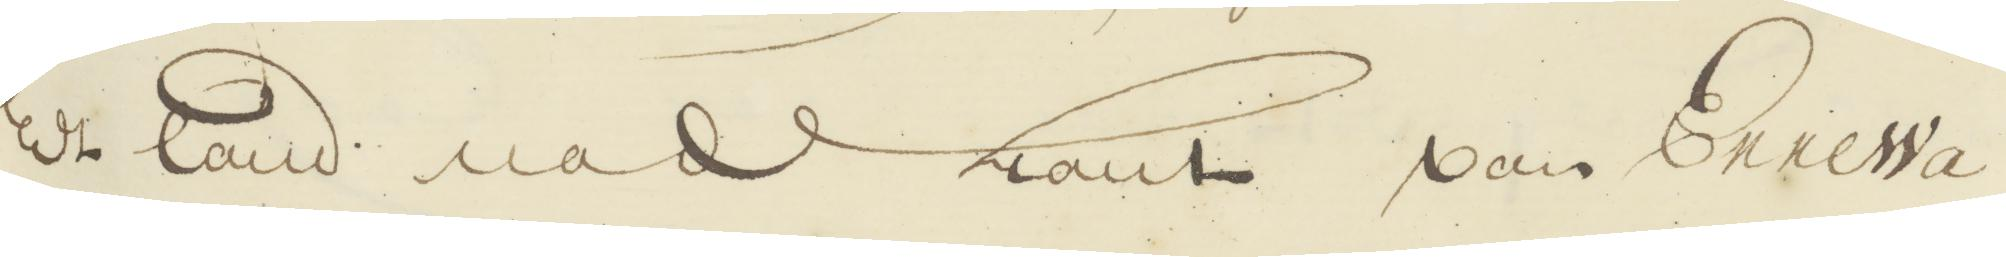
het land na de kant van Errewa
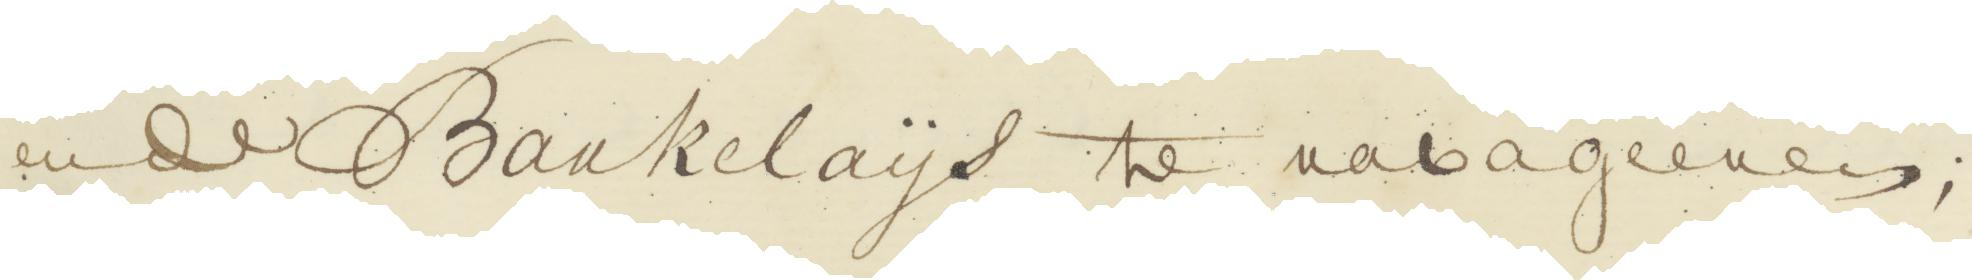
en de Barkelaijs te ravageeren;
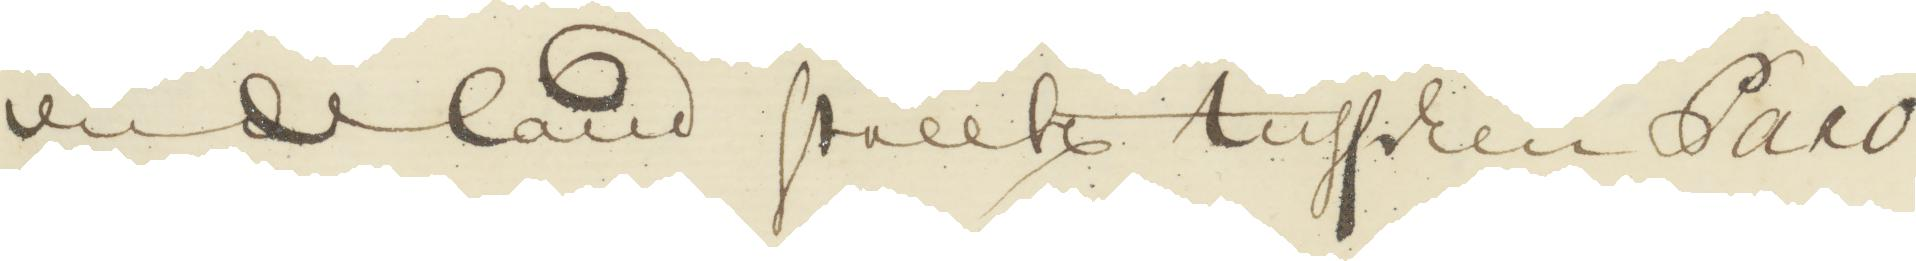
en de land streek tusschen Paro
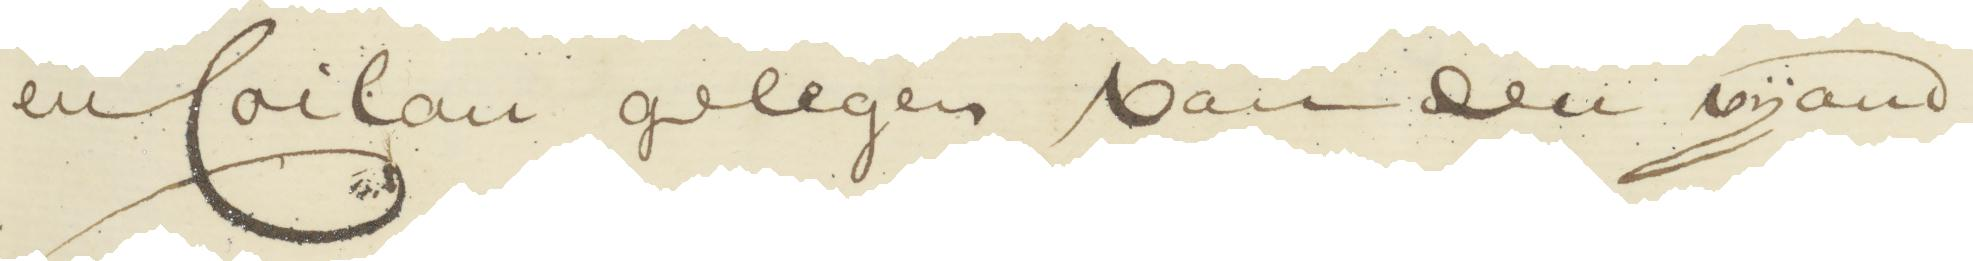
en Coilan gelegen van den vijand
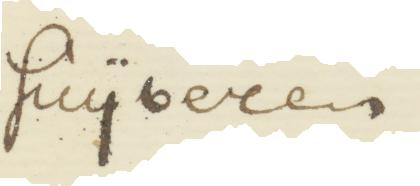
suijveren
